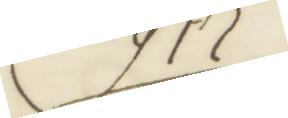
917
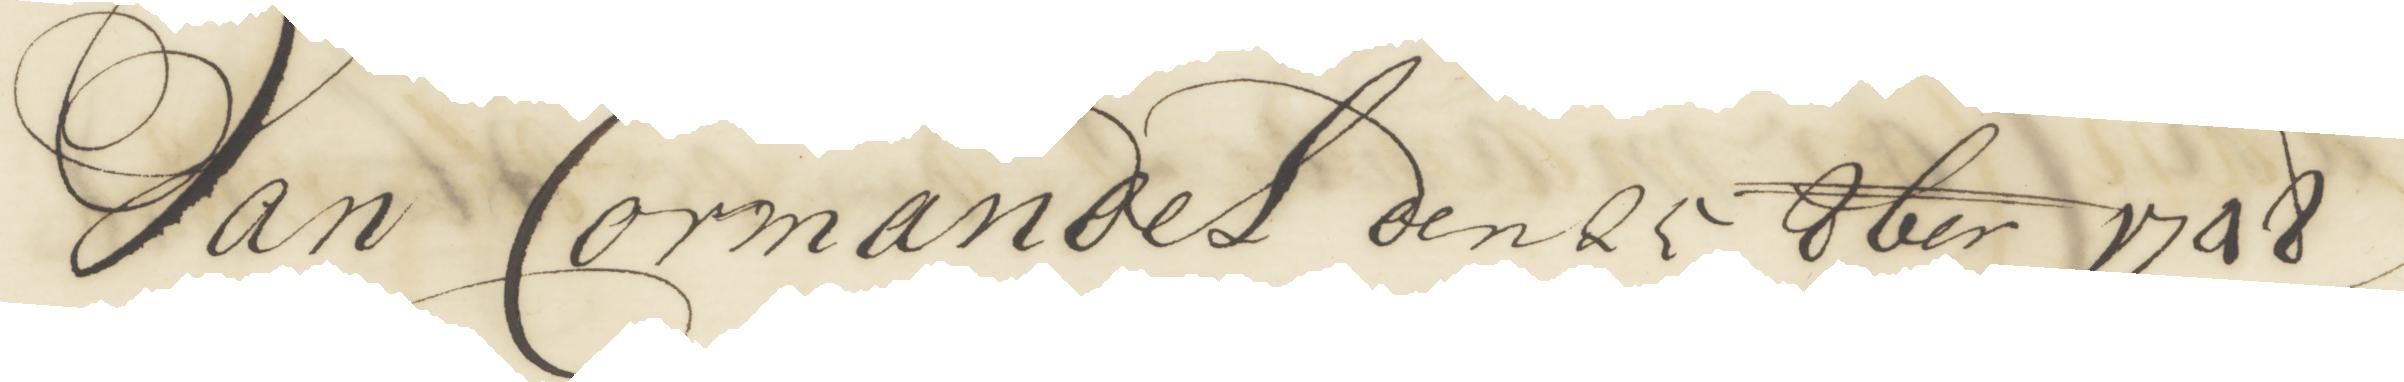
Van Cormandel den 25 8ber 1748
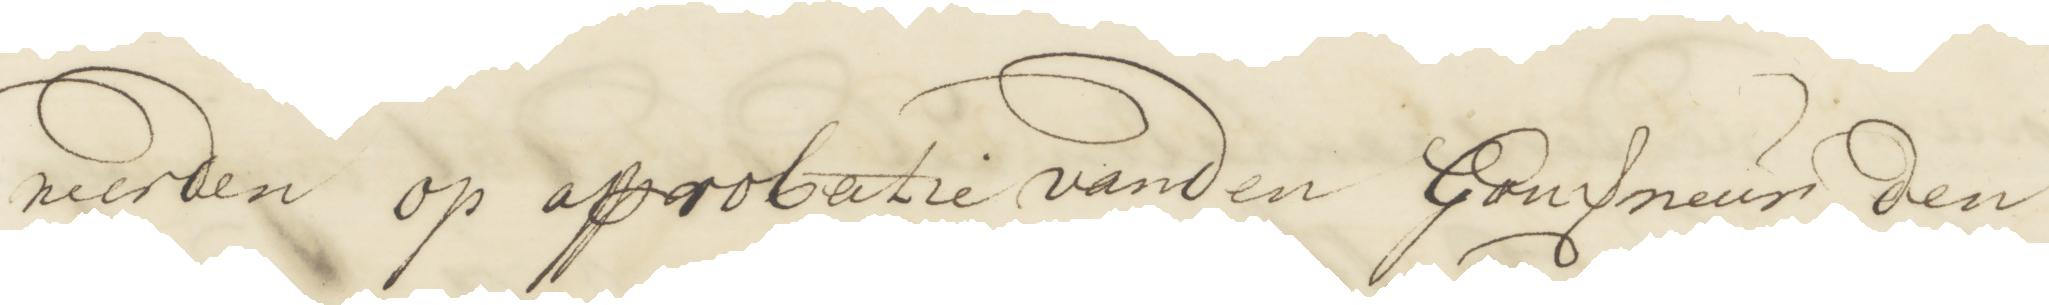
neerden op approbatie van den Gouverneur den
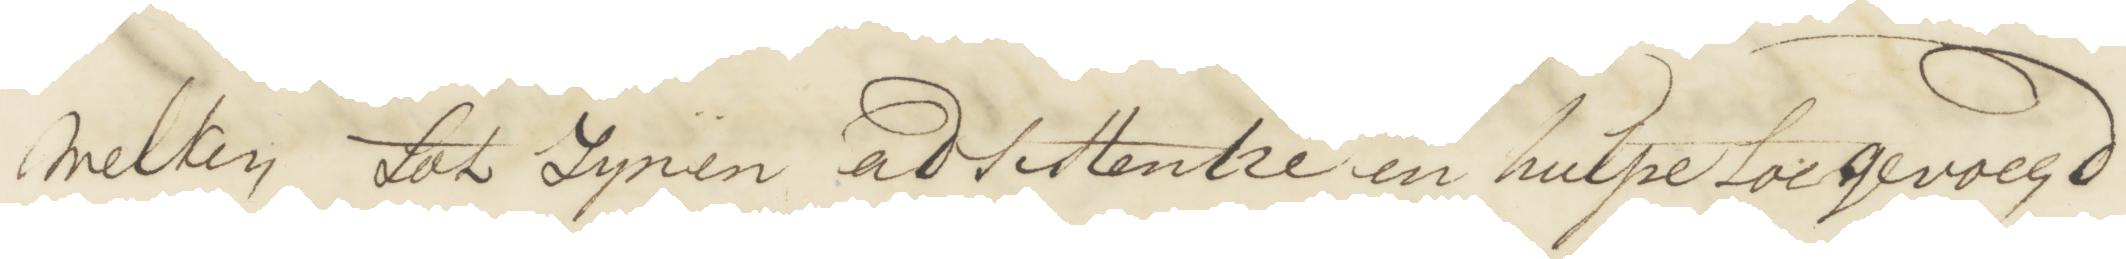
welken tot zijnen adsistentie en hulpe toegevoegd
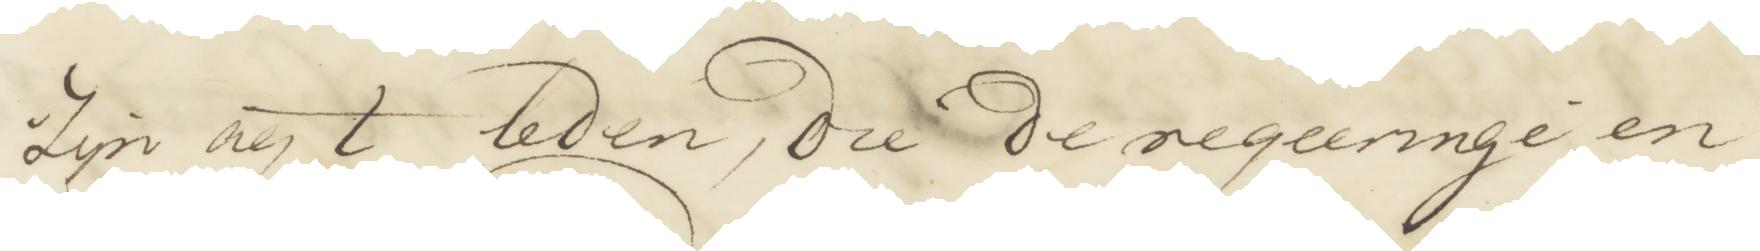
zijn agt leden, die de regeeringe en
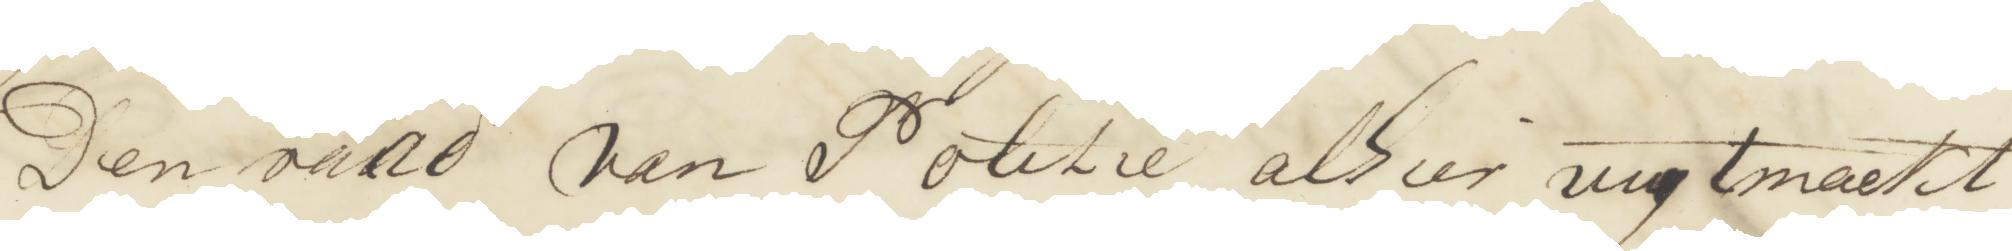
Den raad van Politie alhier uigtmaekt
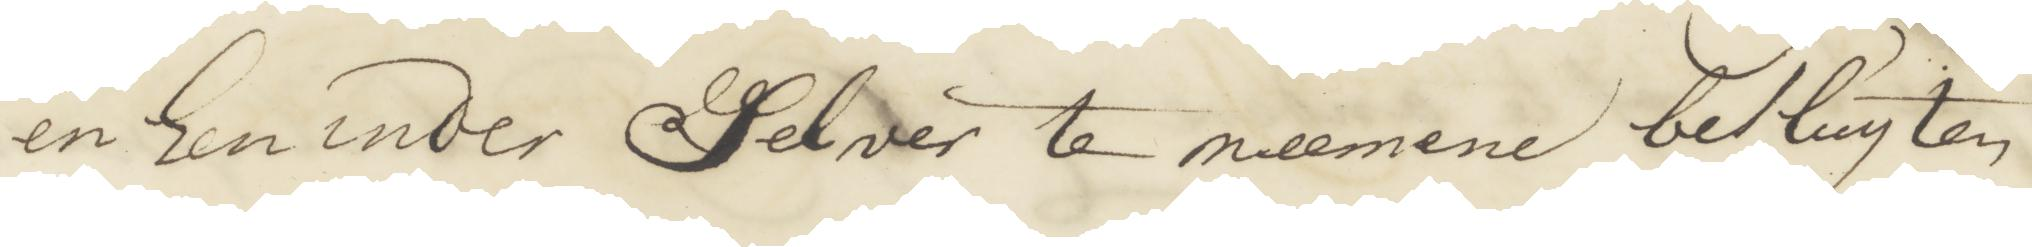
en hen inder Selver te neemene besluijten
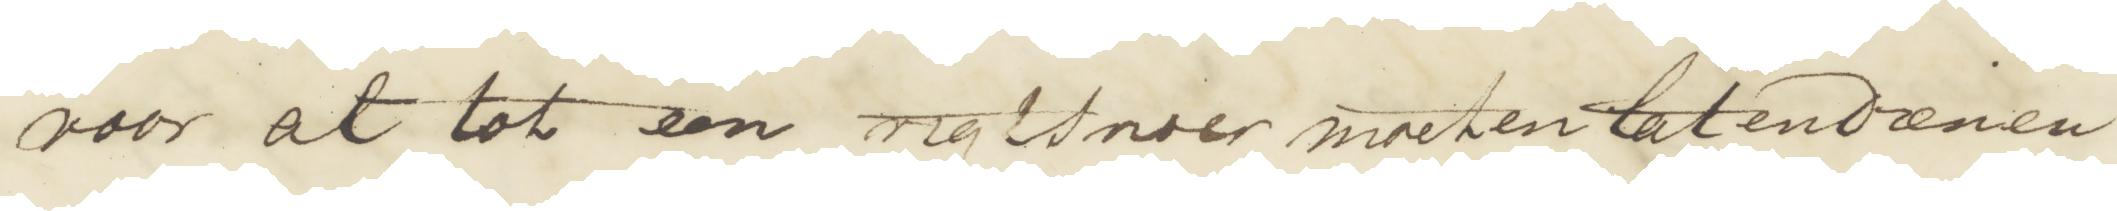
voor al tot een rigtsnoer moeten laten dienen
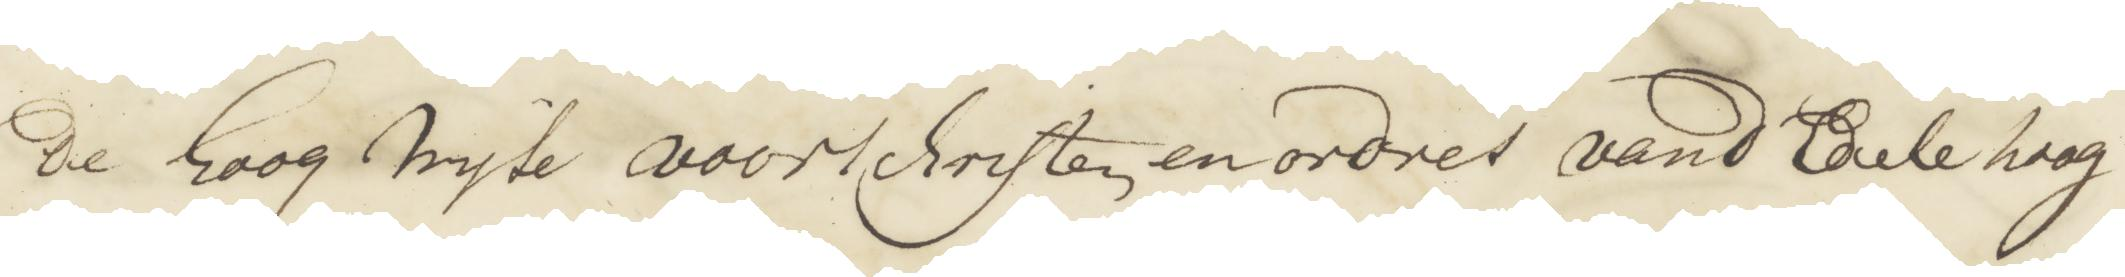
de hoog wijse voorschriften en ordres vand Edele hoog
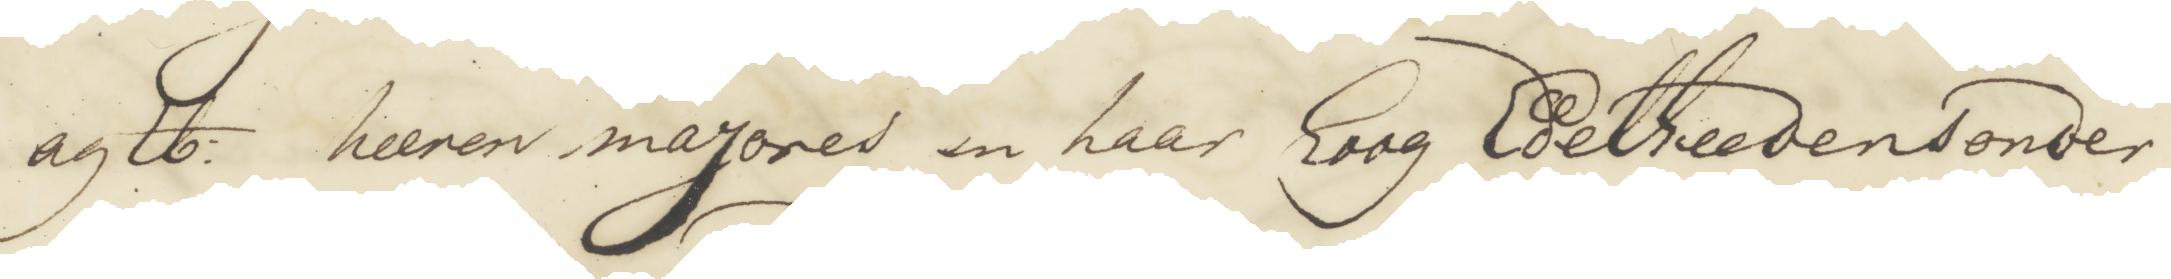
agtb: heeren majores en haar hoog Edelheedens onder
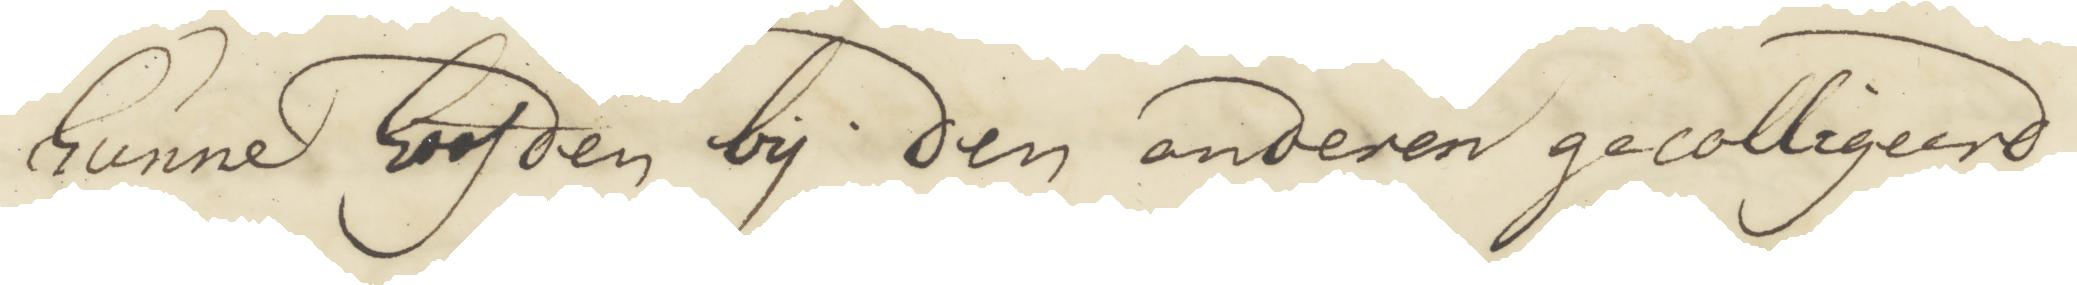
hunne hoofden bij den anderen gecolligeerd,
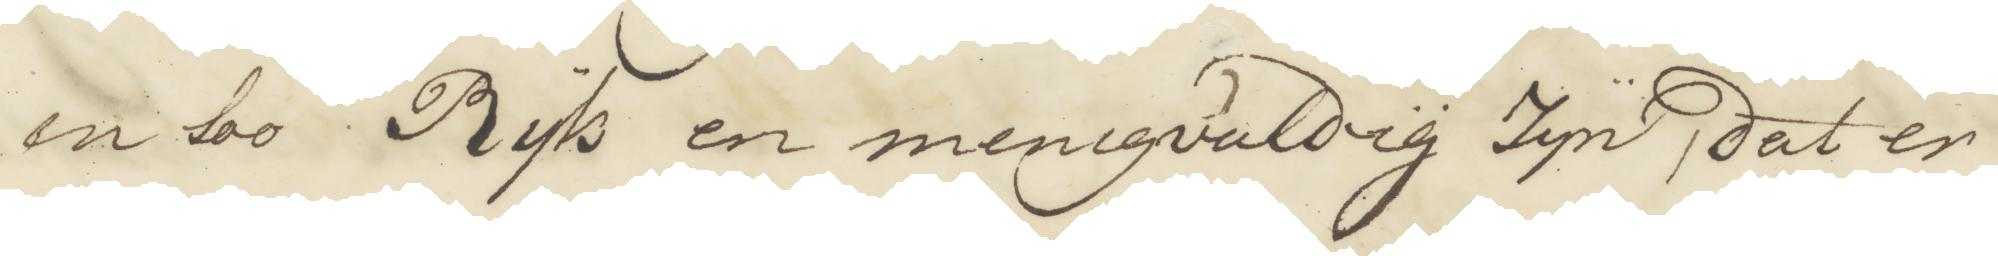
en soo Rijk en menigvuldig zyn, dat er
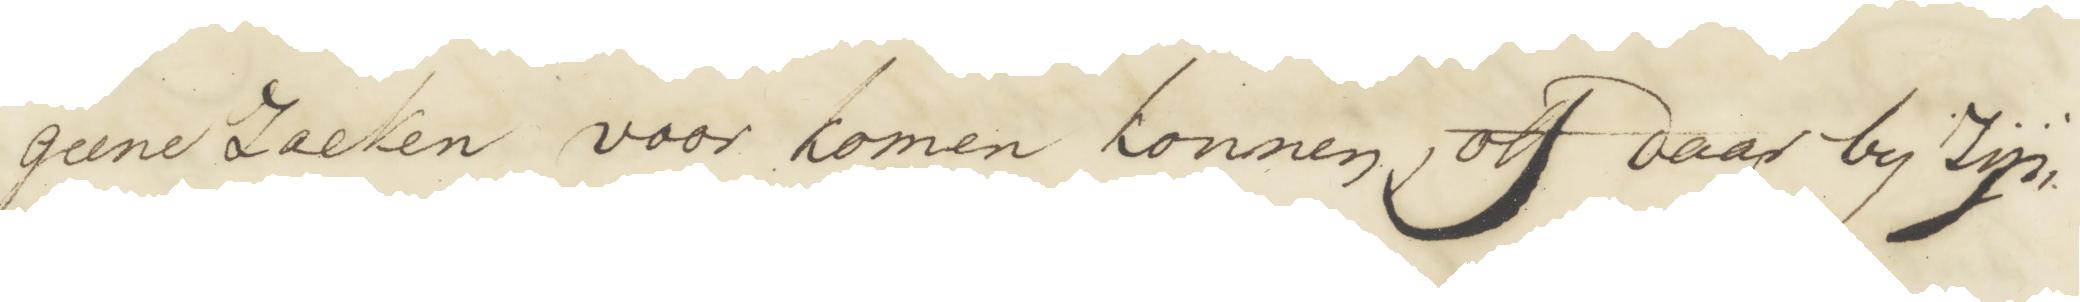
geene zaeken voor komen konnen, off daar bij zijn„
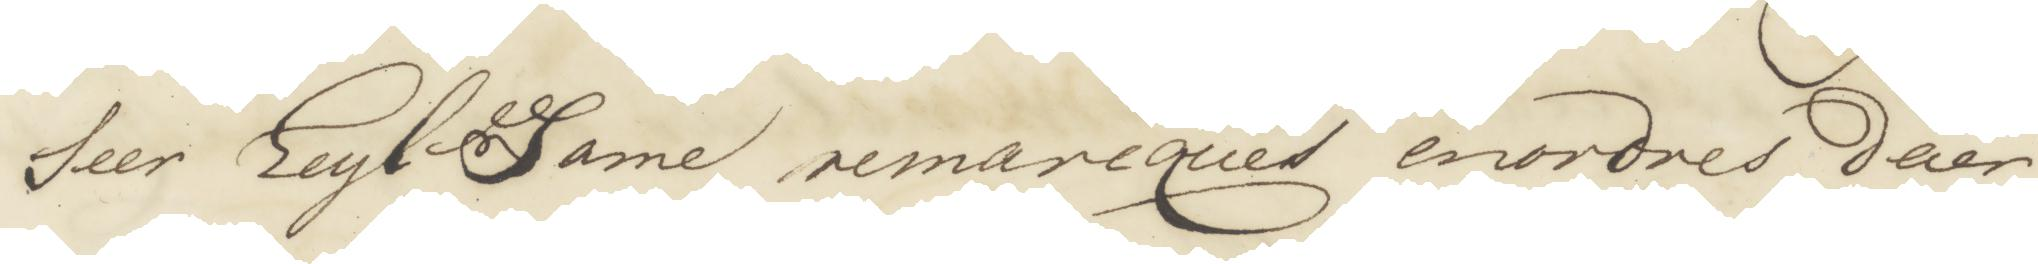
seer heijl Same remarcques en ordres daar
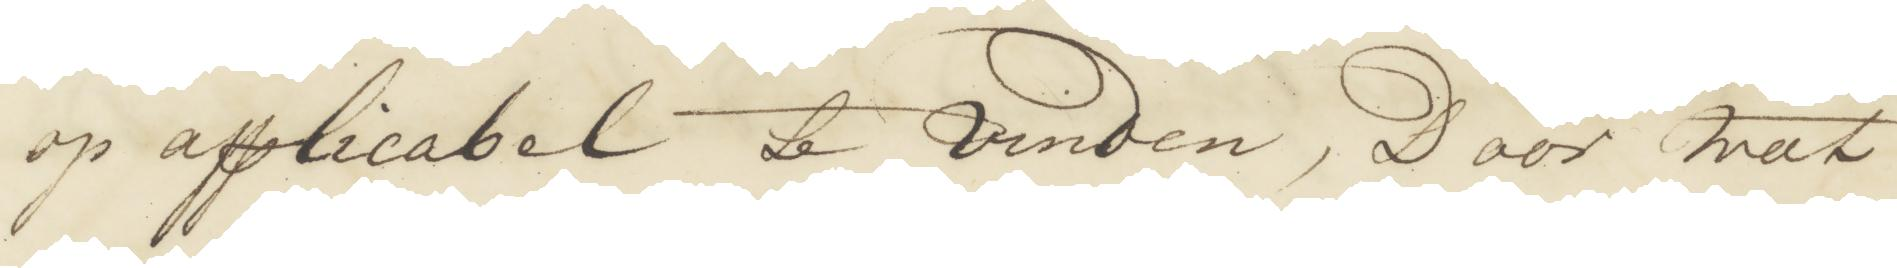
op applicabel te vinden, Door wat
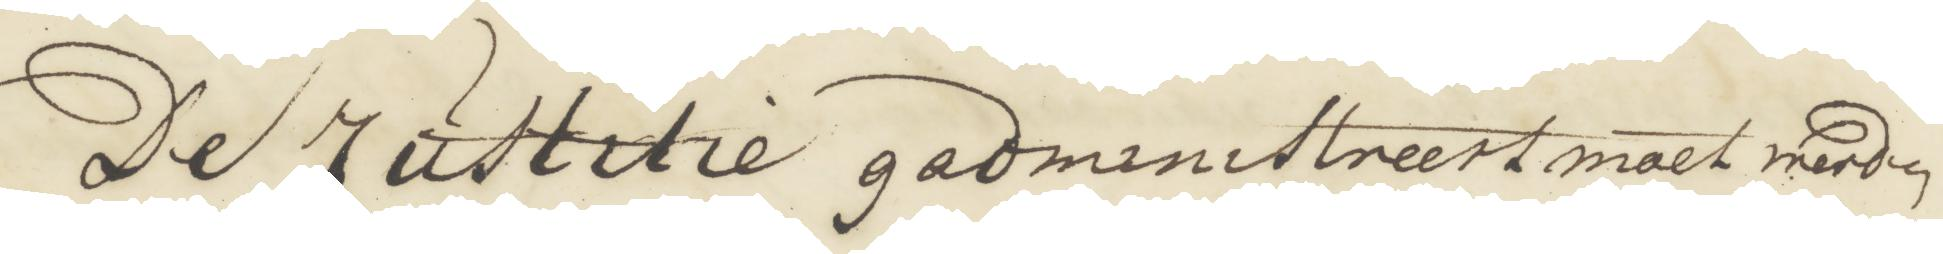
De Justitie gadministreert moet werden
